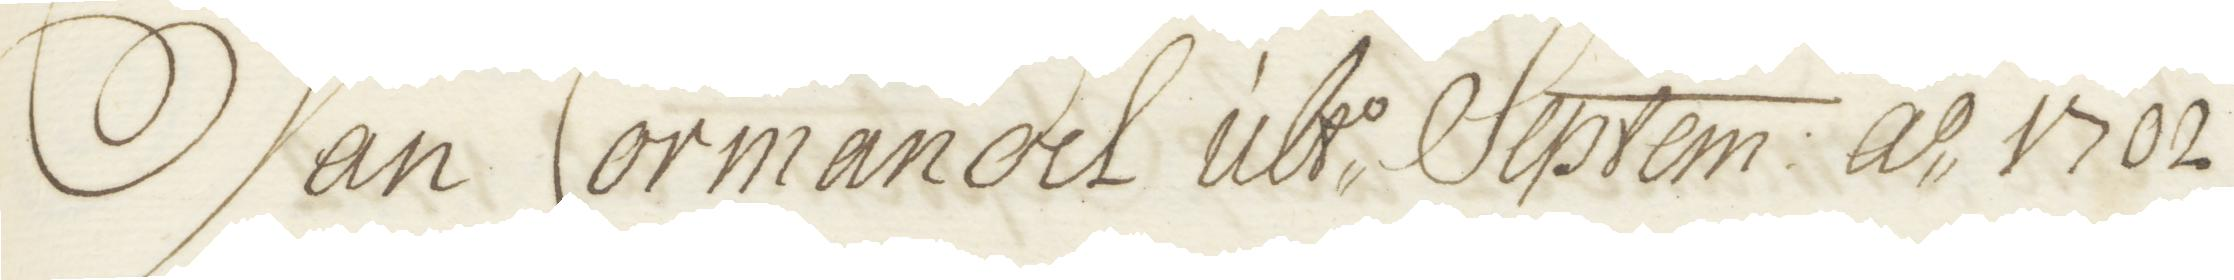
Van Cormandel ult„o Septem: a„o 1702
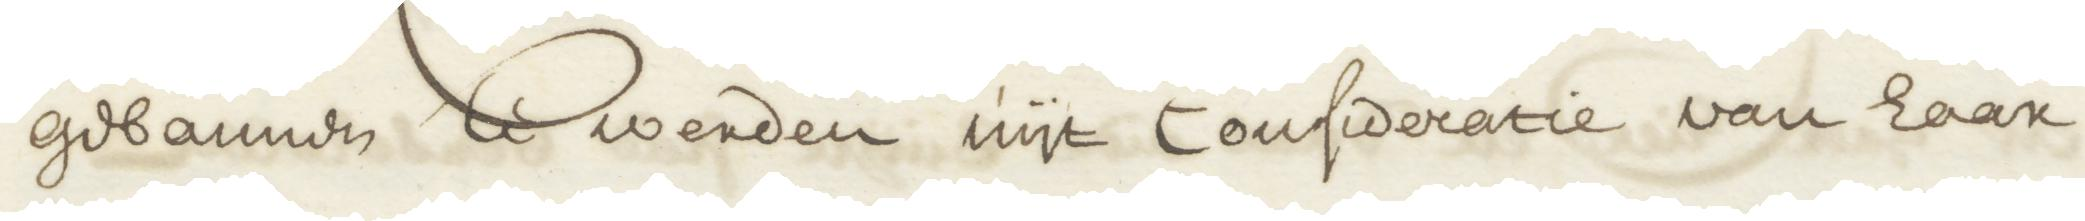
gebannen te werden uijt consideratie van haar
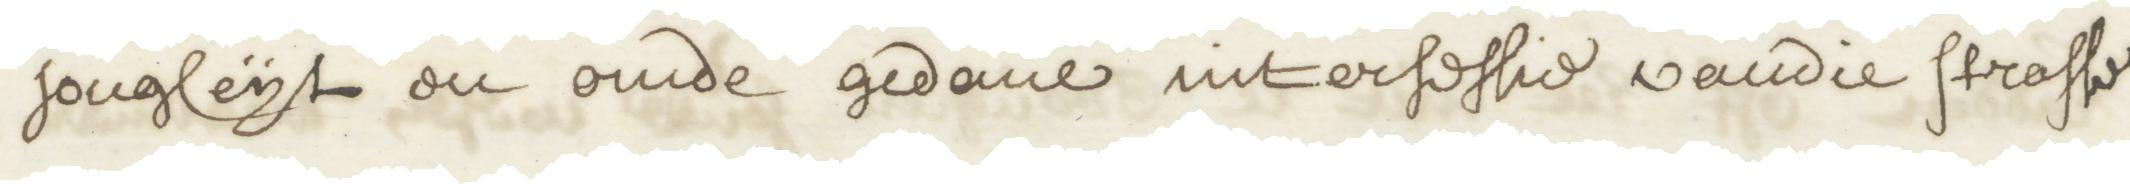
jongheijt en omde gedane intersessie van die straffe
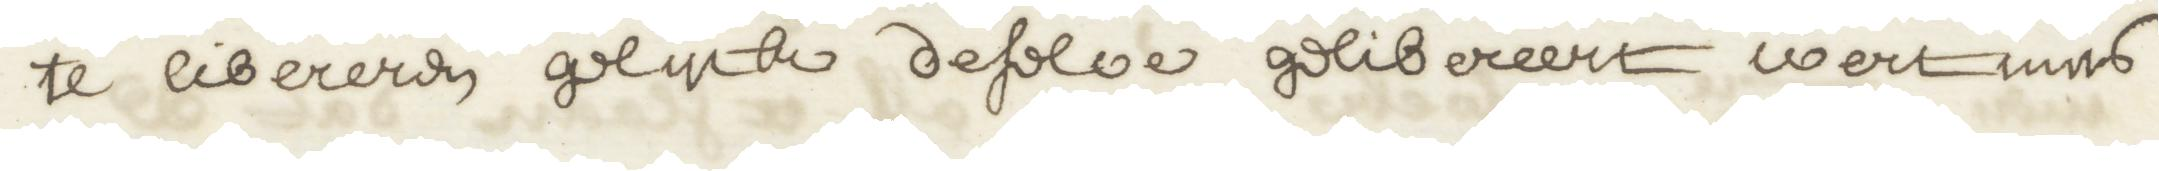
te libereren gelijck deselve gelibereert wert mits
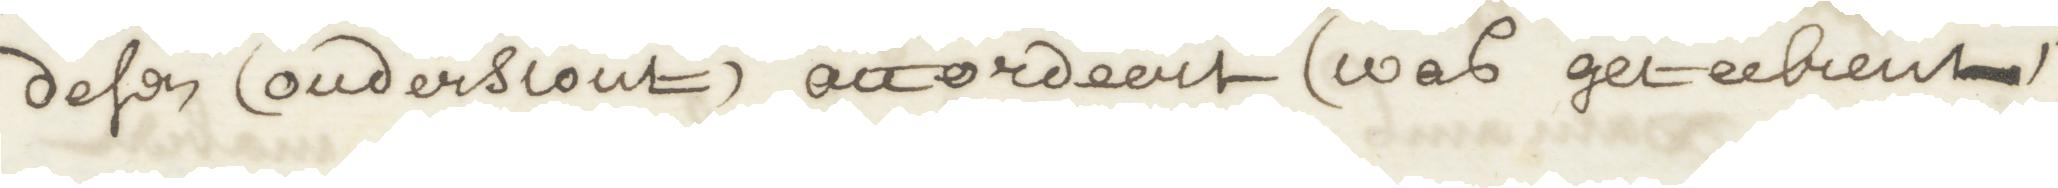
desen (onderstont) accordeert (was geteekent)
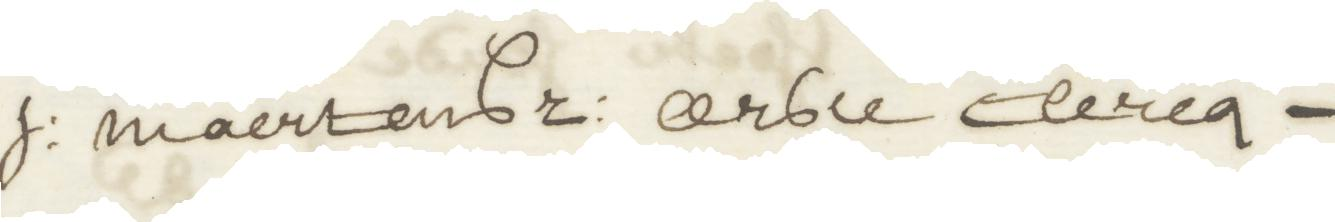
j: maertensz: eerste clercq-
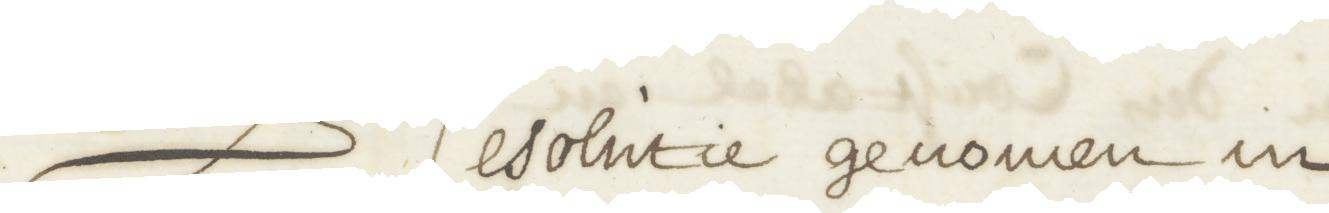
Resolutie genomen in
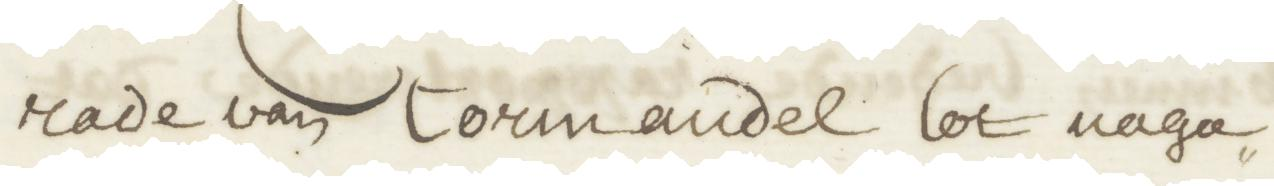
rade van cormandel tot naga„
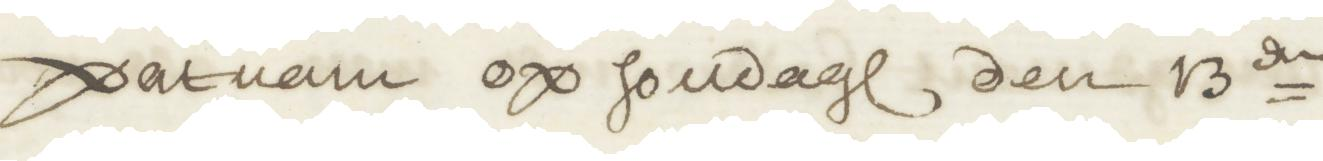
patnam op sondagh den 13=en
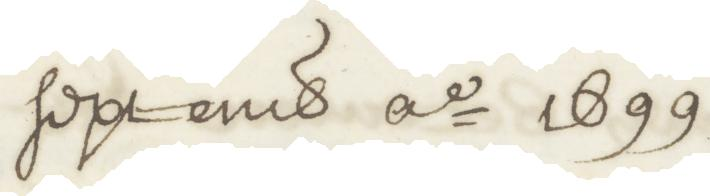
septemb a=o 1699
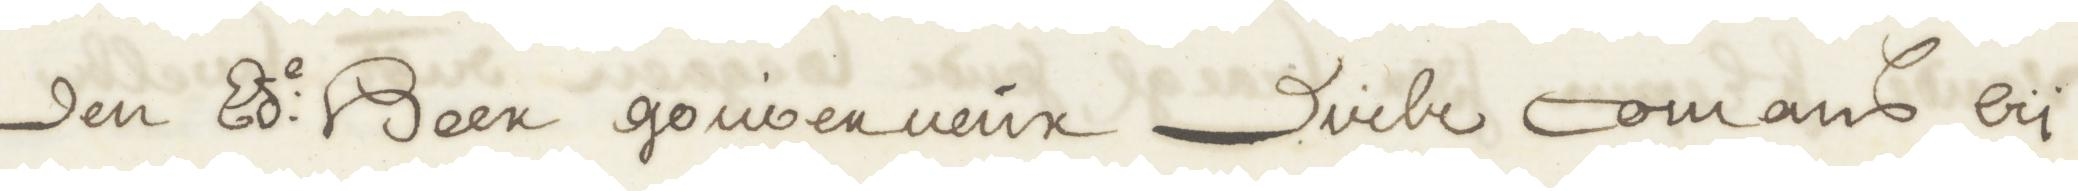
Den Ed:e Heer gouverneur Dirk comans bij
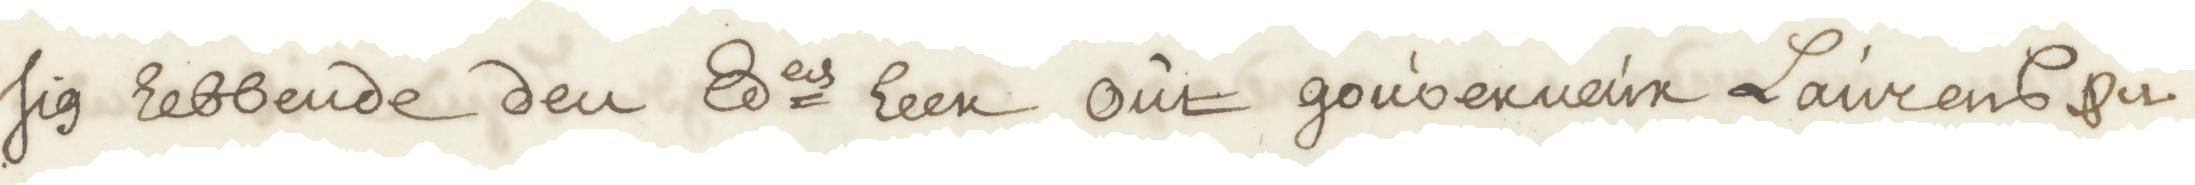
sig hebbende den Ed=ed heer out gouverneur Laurens pit
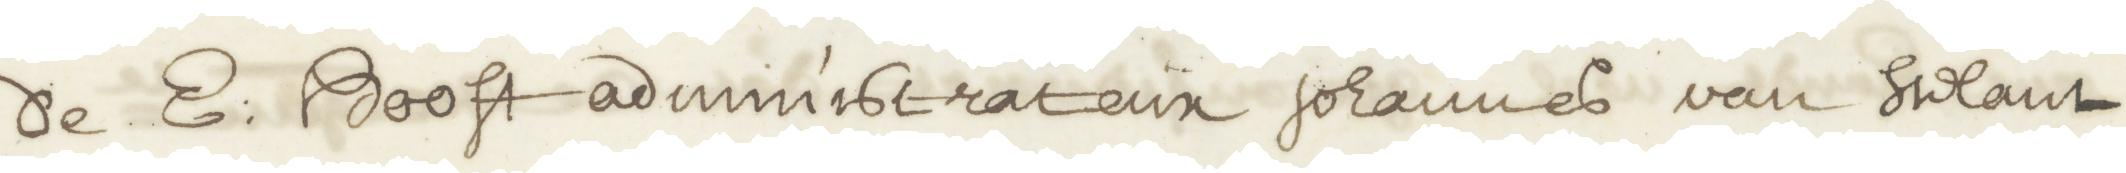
de E: Hooft administrateur johannes van stelant
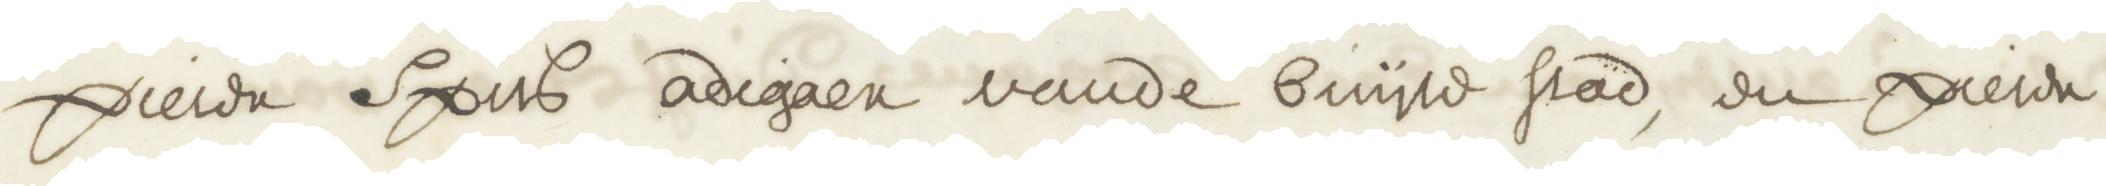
pieter spits adigaer vande buijte stad, en pieter
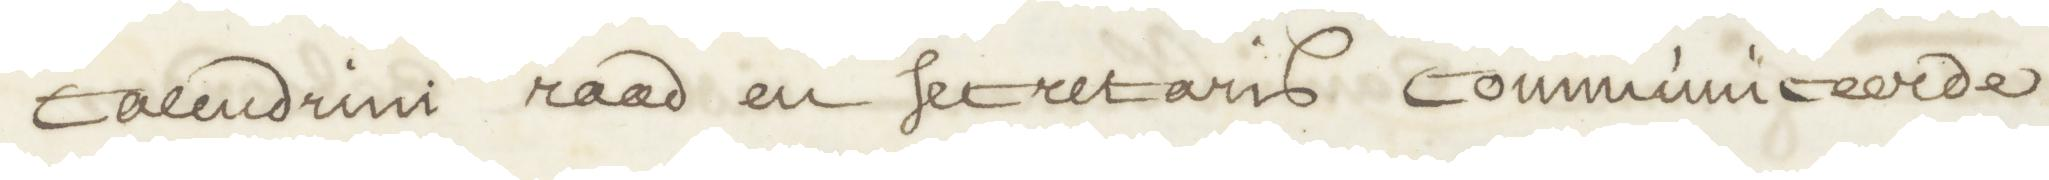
calendrini raad en secretaris communiceerde
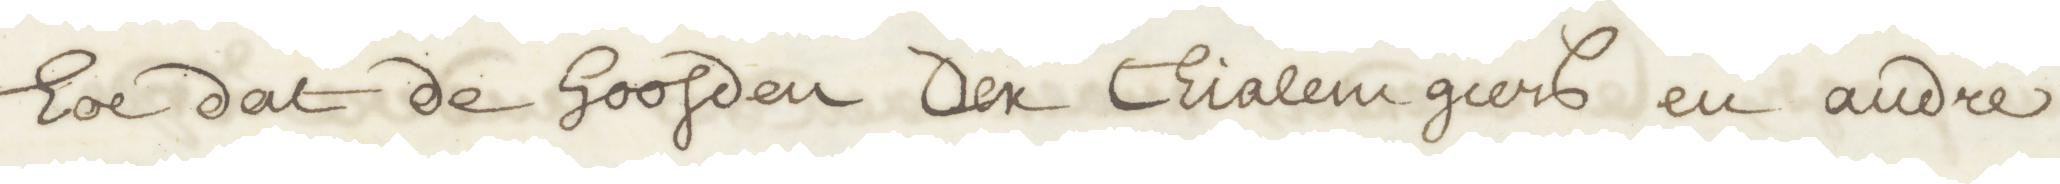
hoe dat de hoofden der chialemgiers en andre
